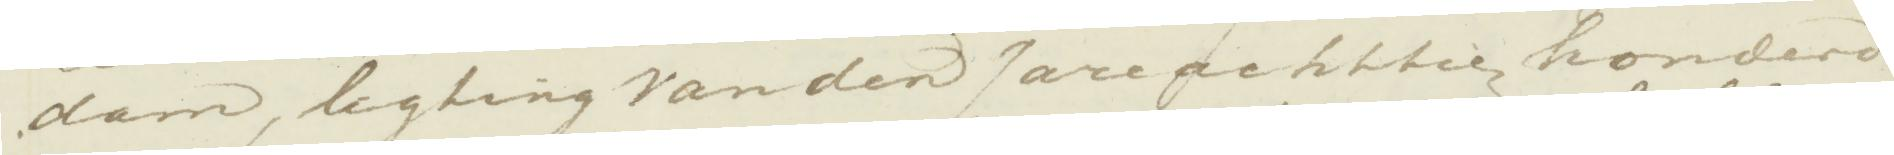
„dam, ligting van den Jare achttien honderd
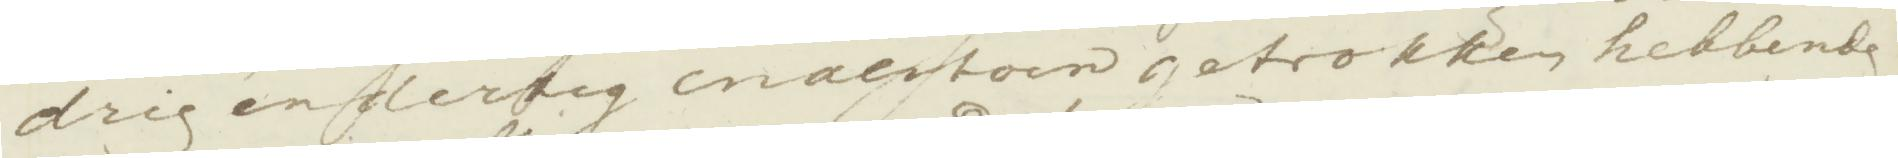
drie en dertig en als toen getrokken hebbende
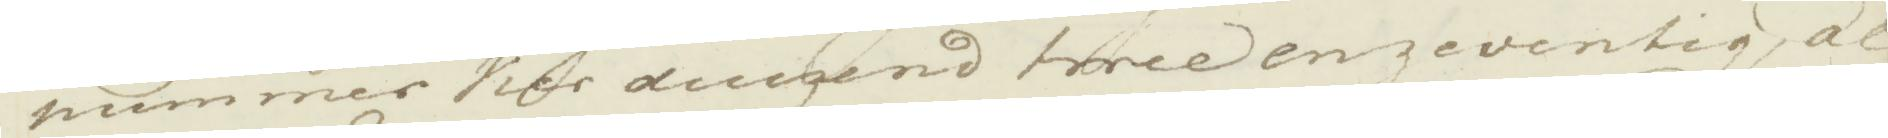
nummer Vier duizend twee en zeventig, al
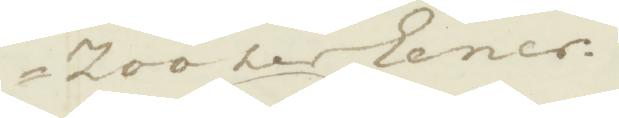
=zoo ter Eener.
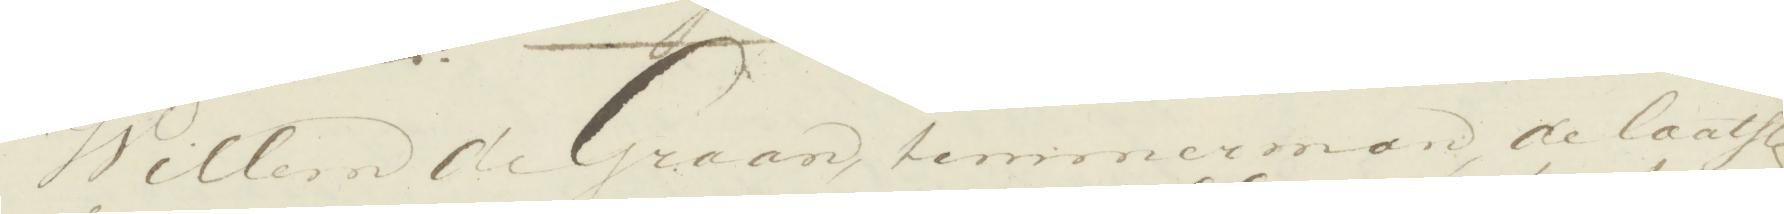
Willem de Graan, timmerman, de laatste
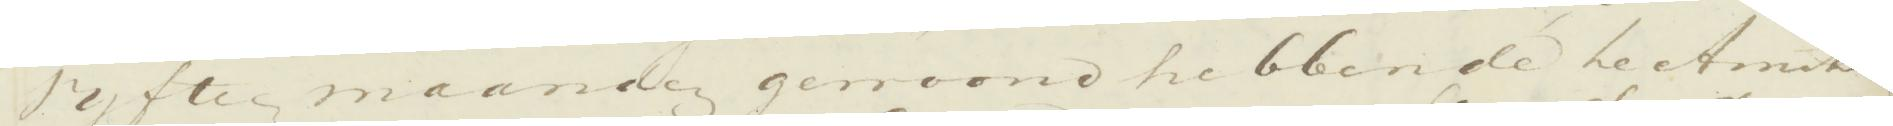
Vyftien maanden gewoond hebbende te Amster
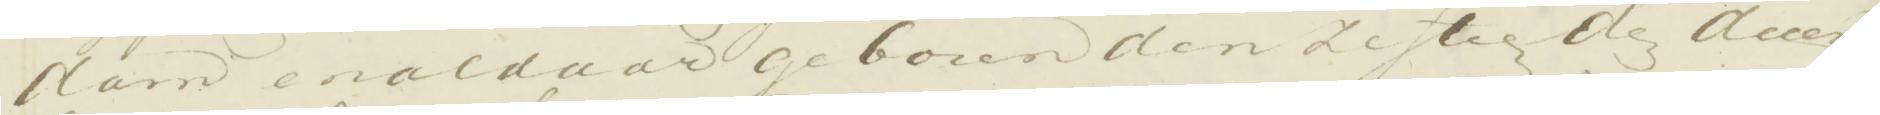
dam en aldaar geboren den zestien den decem
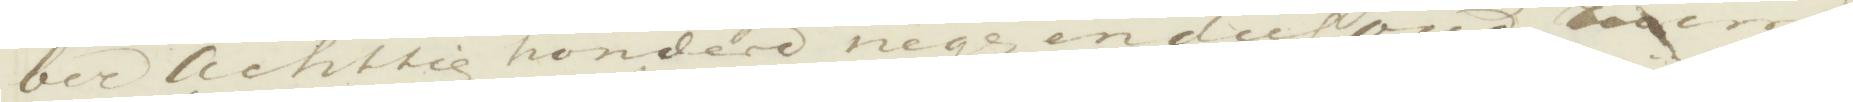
ber Achttien honderd negen en dees oud zoon
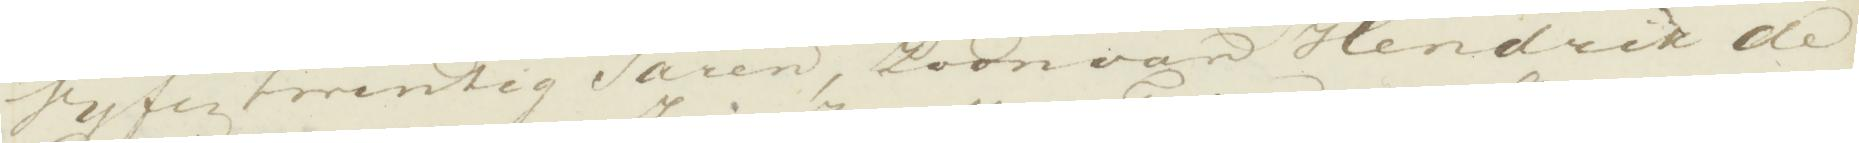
Vyfentwintig Iaren, zoon van Hendrik de
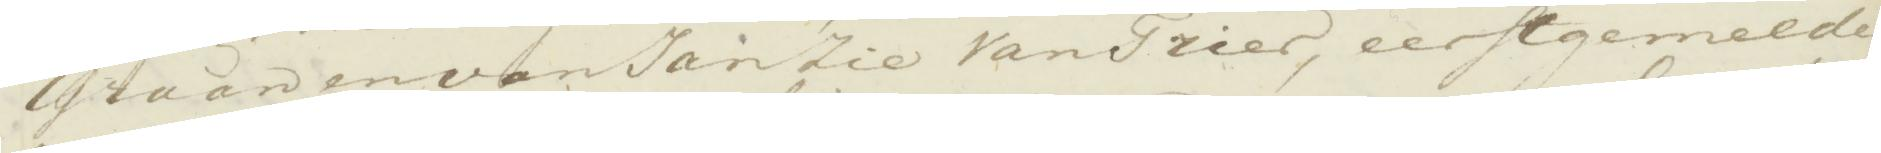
Graan en van Ianzie van Trier, eerstgemelde
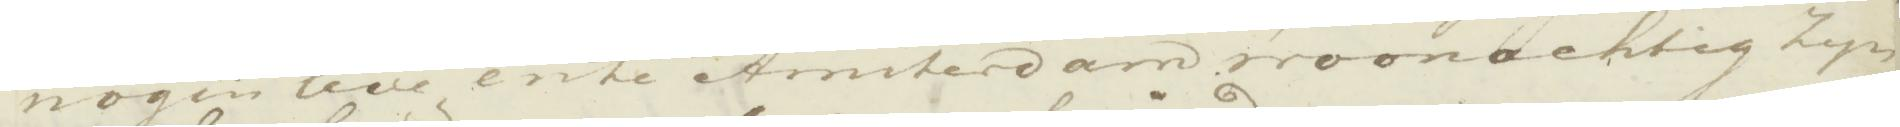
nog in leve en te Amsterdam woonachtig zyn
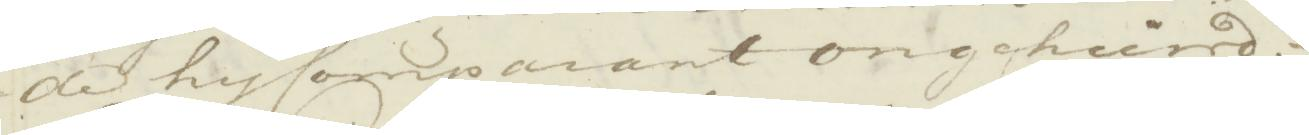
de hy Comparant ongehuwd.
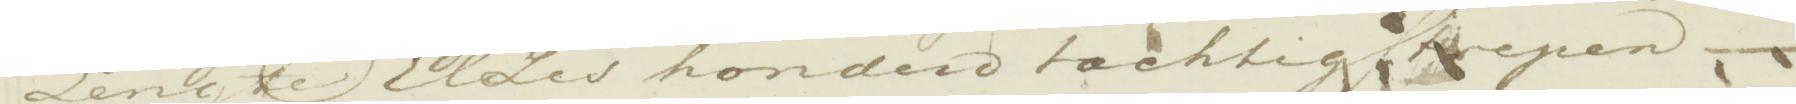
Lengte El zes honderd tachtig strepen
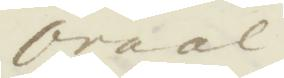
Ovaal
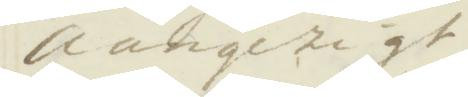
Aangezigt
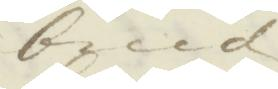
breed
